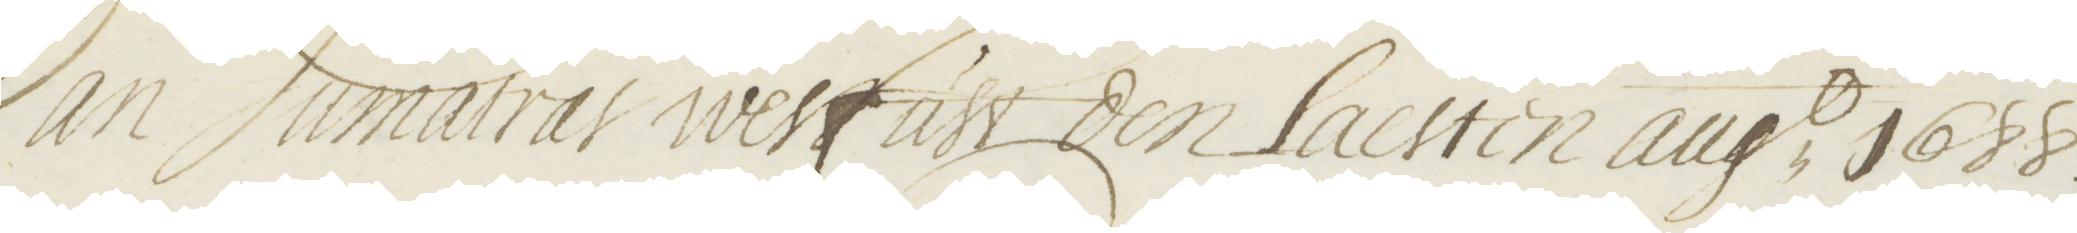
Van Sumatras westCust den laesten aug„o 1688.
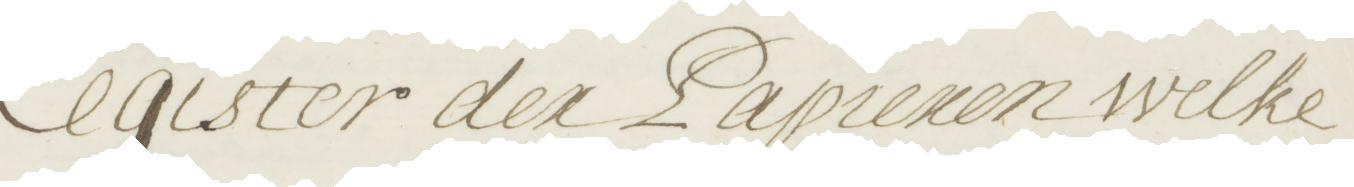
Register der Papieren welke
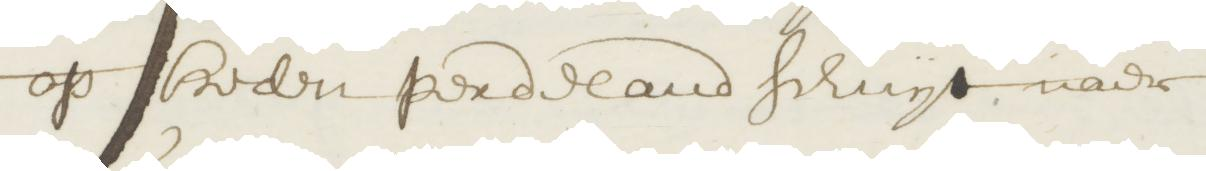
op heden perdeland schuijt naer
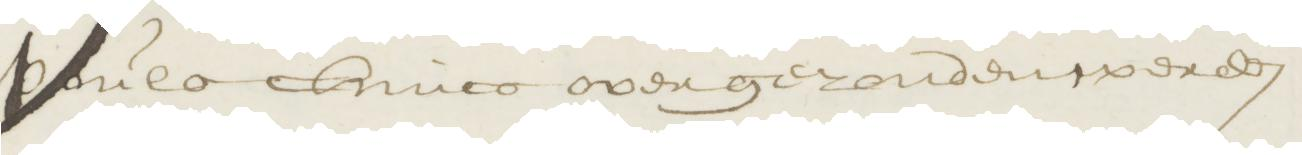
poulo chinco overgezonden werden
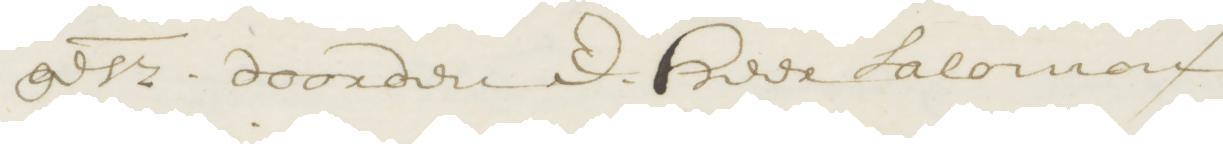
gesz: door den E: Heer Salomon
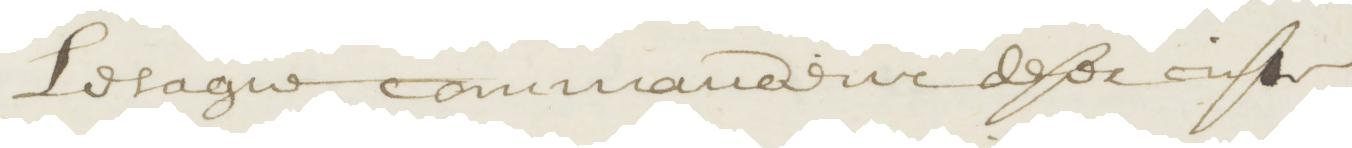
Lesagie commandeur deser custe
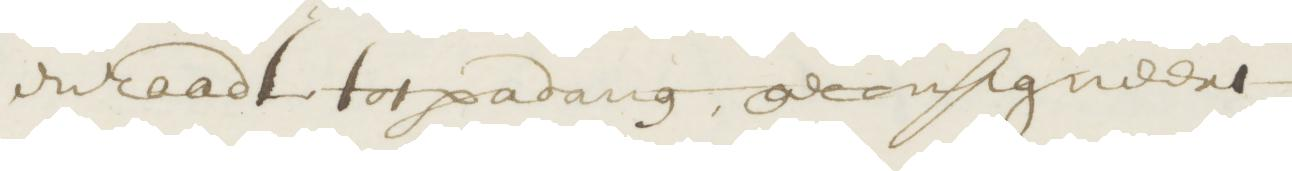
en raadt tot padang, geconsigneert
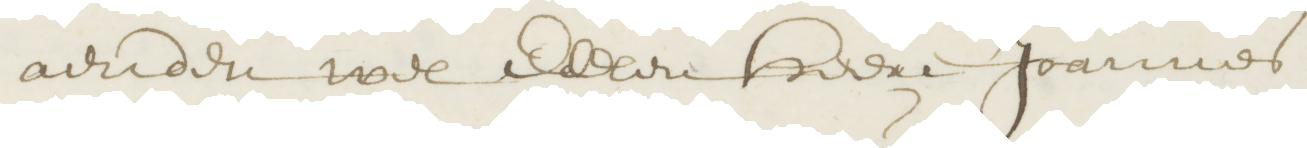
aenden wel Edelen Heere Joannes
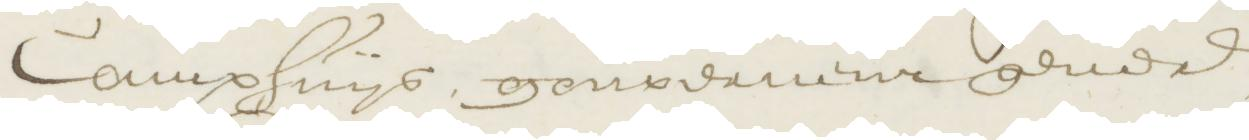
Camphuijs gouverneur gener„
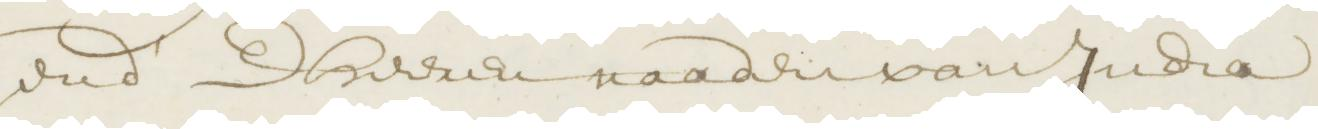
en d’ Eheeren raaden van India
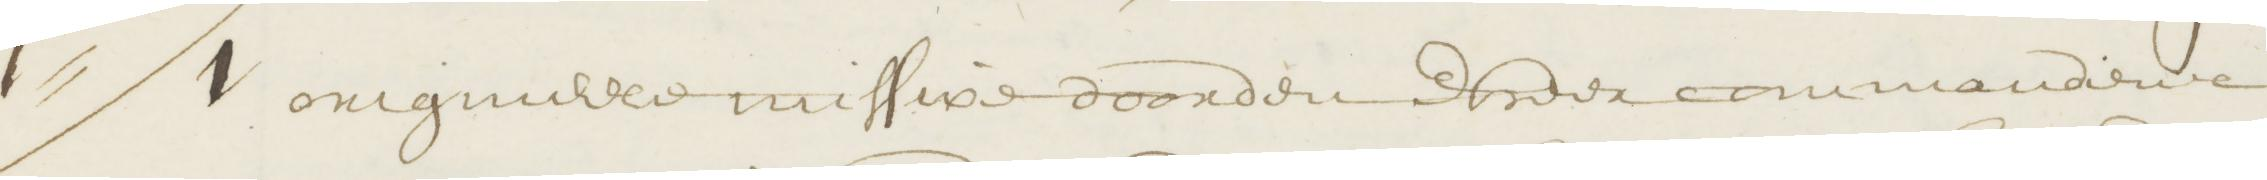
N„o 1 origineele missive door den Eheer commandeur
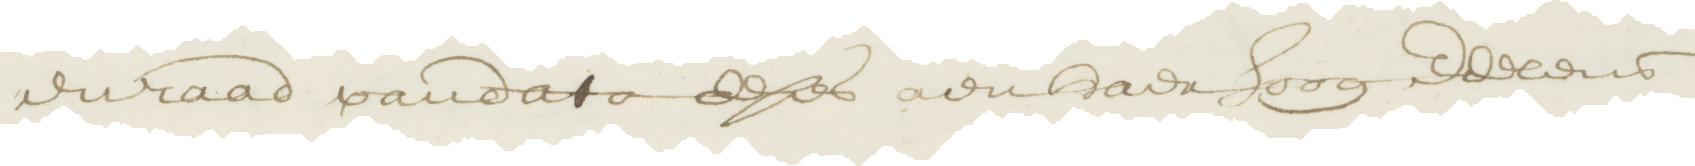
en raad van dato deses aen haer hoog Edelens
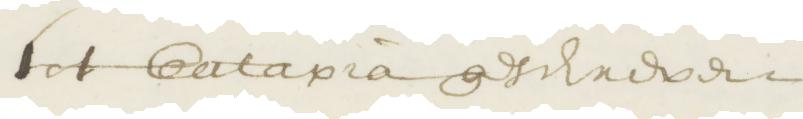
tot batavia geschreven
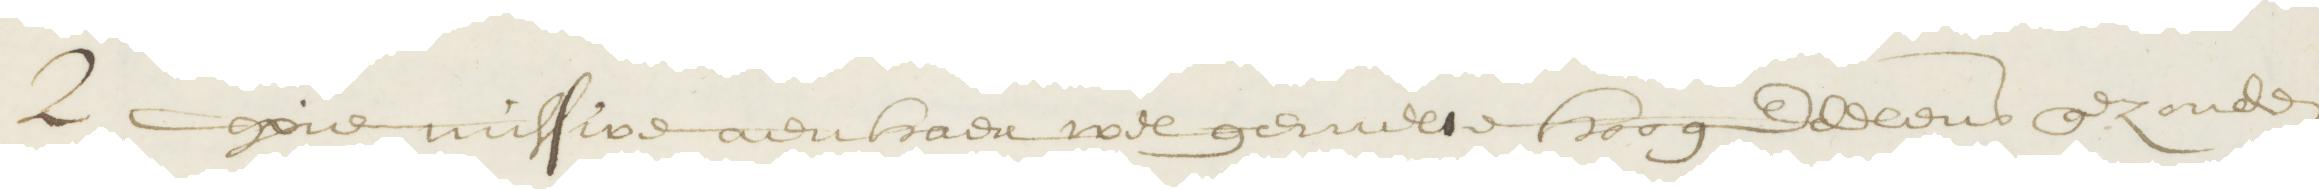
2 copie missive aen haer wel gemelte hoog Edelens gezonden
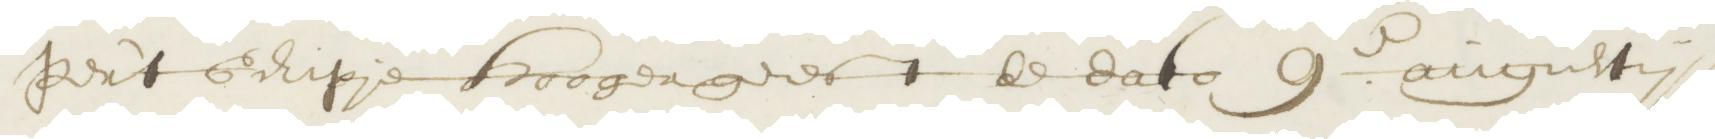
per 't schipje hoogergeest de dato 9:e augustijs
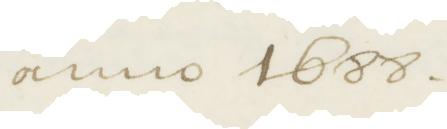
anno 1688.
